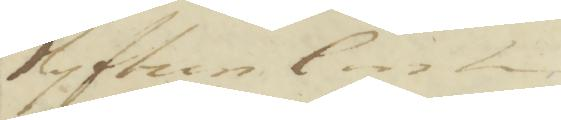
Vyftien Cents
